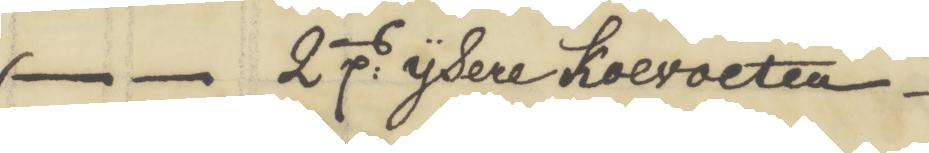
— — 2 p:s ijsere koevoeten -
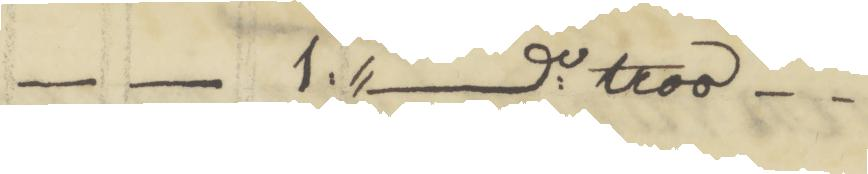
— —1:„ _:o troo - -
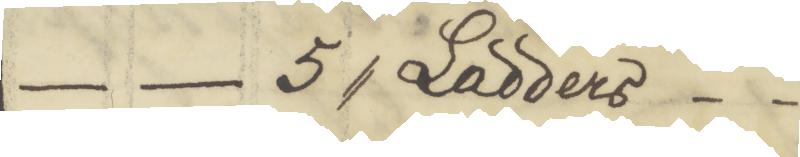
— — 5:„ Ladders - -
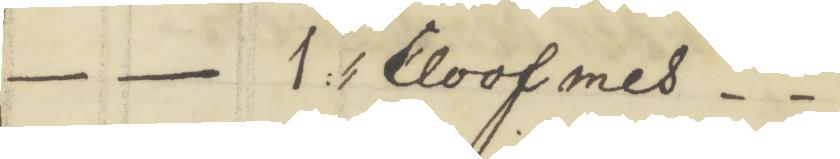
— — 1:„ Cloofmes - -
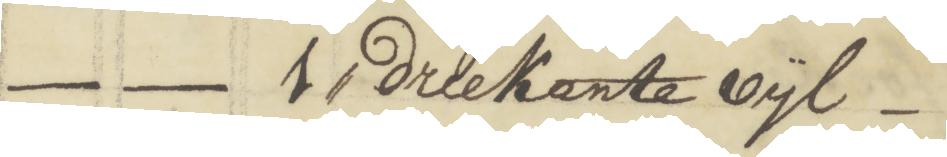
— — 1„ driekante vijl -
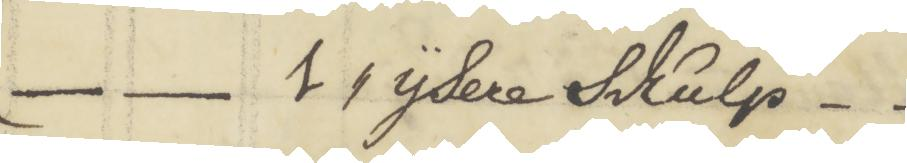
— — 1„ ijsere schulp -
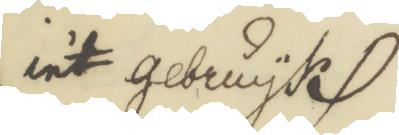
in't gebruijk
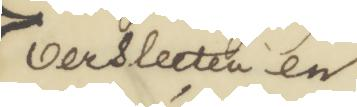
versleeten en
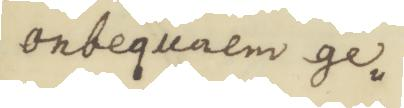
onbequaem ge„
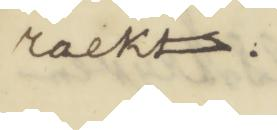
raekt:
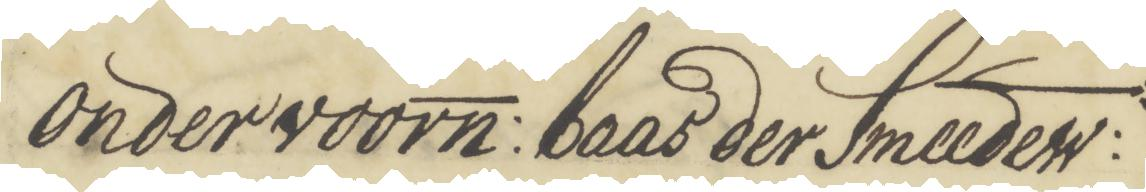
onder voorn: baas der Smeedew:
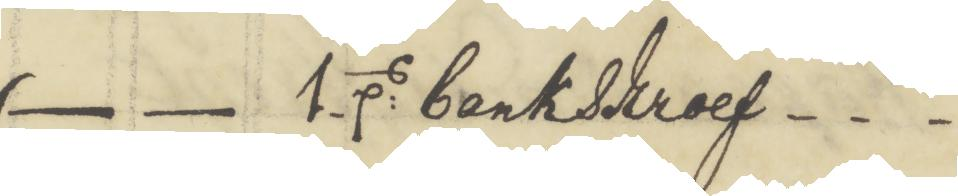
— — 1.p:s bankschroef - - -
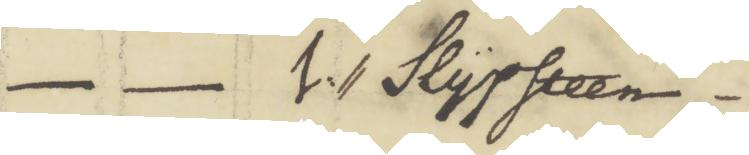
— — 1.„ slijpsteen -
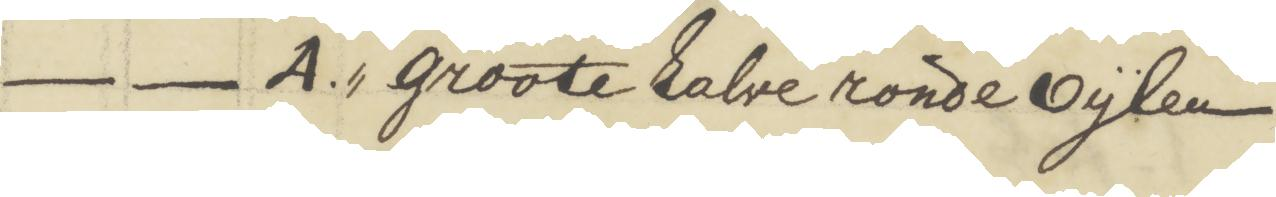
— — 4.„ groote halve ronde vijlen
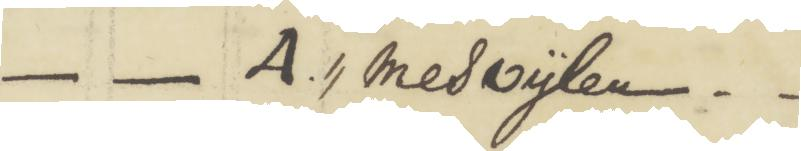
— — 4.„ mesvijlen - -
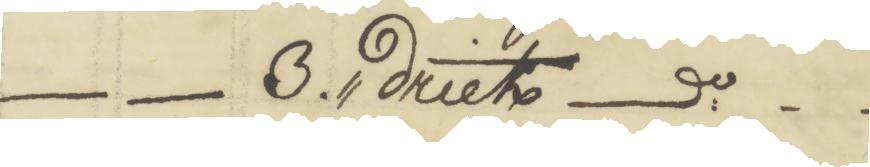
— — 3.„ driek _:o
